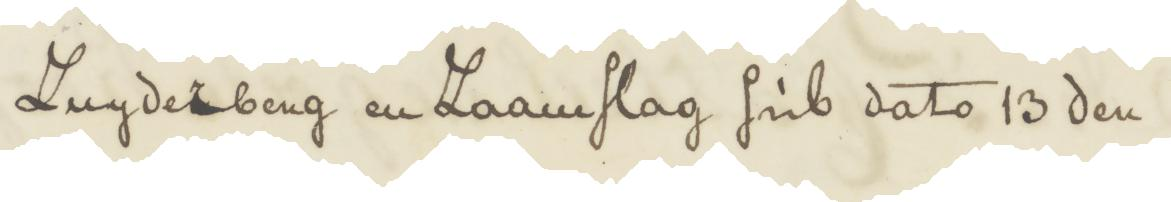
zuyderberg en zaamslag sub dato 13 den
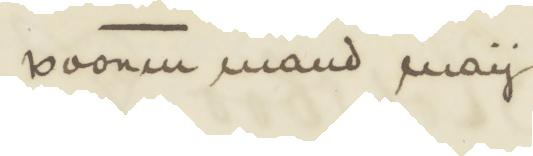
voorm mand maij
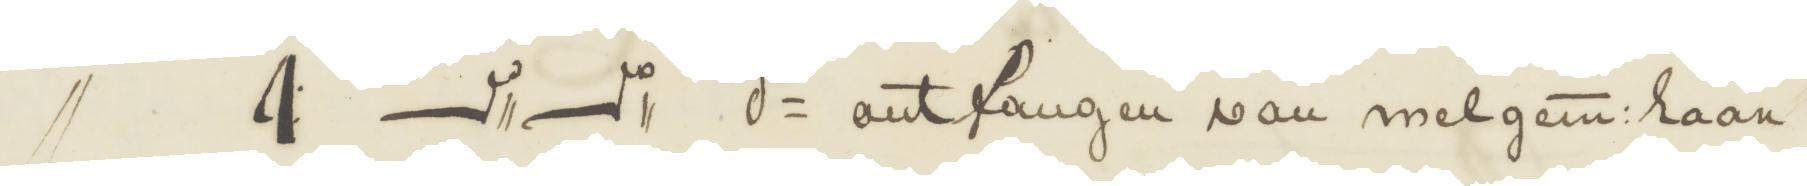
„ 4: _„o _„o d=o ontfangen van wel gem: haar
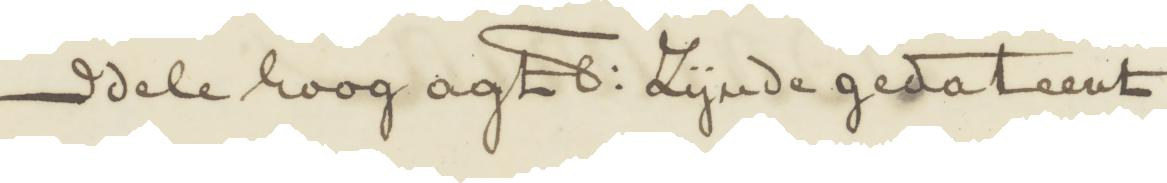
Edele hoog agtb: zijnde gedateert
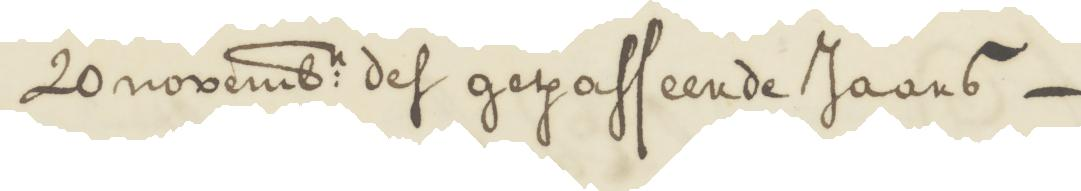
20 novemb:r des gepasseerde Jaars —
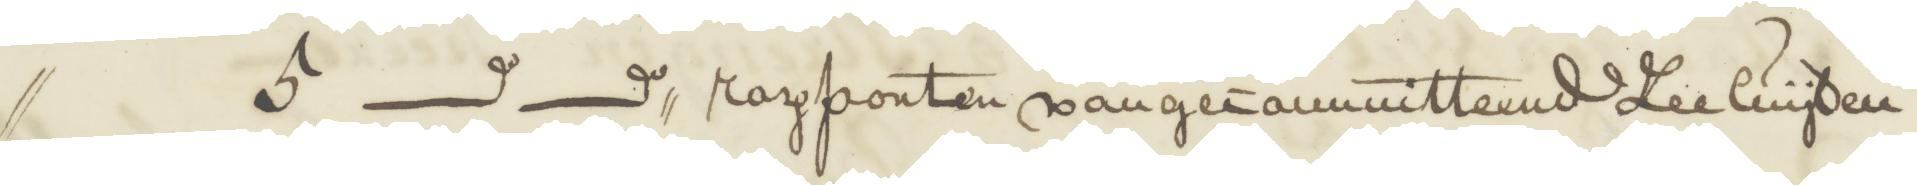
„ 5 _o _„o rapporten van gecommitteerde zeeluijden
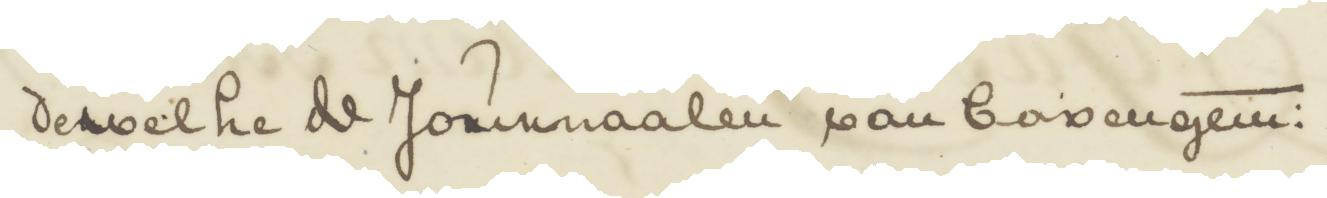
dewelke de Journaalen van bovengem:
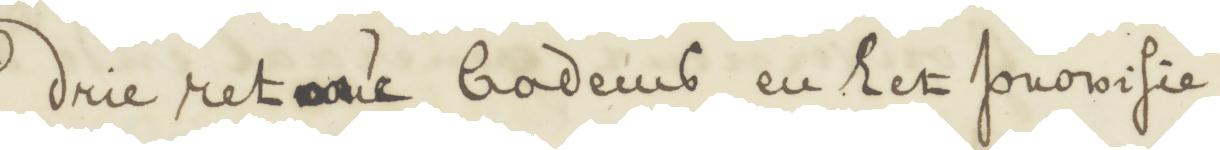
drie retour bodems en het provisie
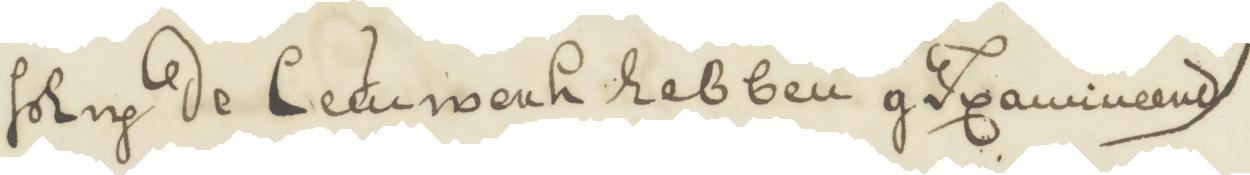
schip de leeuwerk hebben g’Examineerd
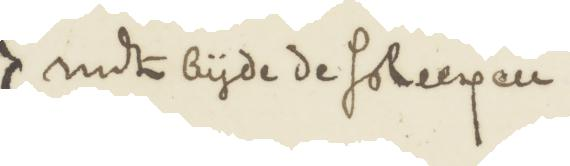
met bijde de scheepen
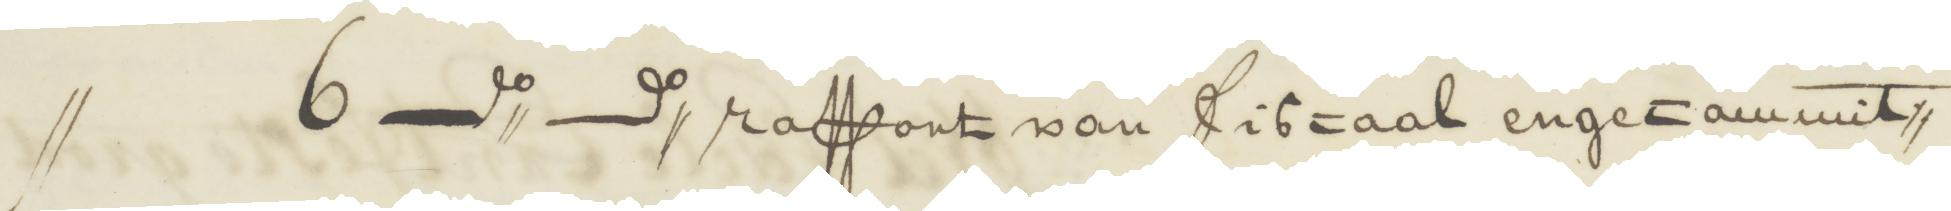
„ 6 _„o _„o rapport van fiscaal en gecommit„
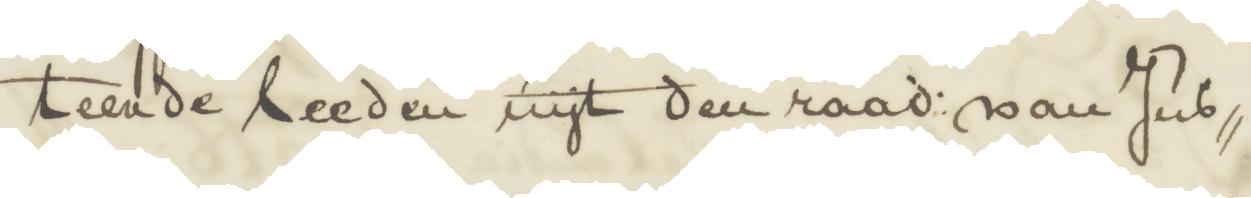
teerde leeden uijt den raad: van Jus„
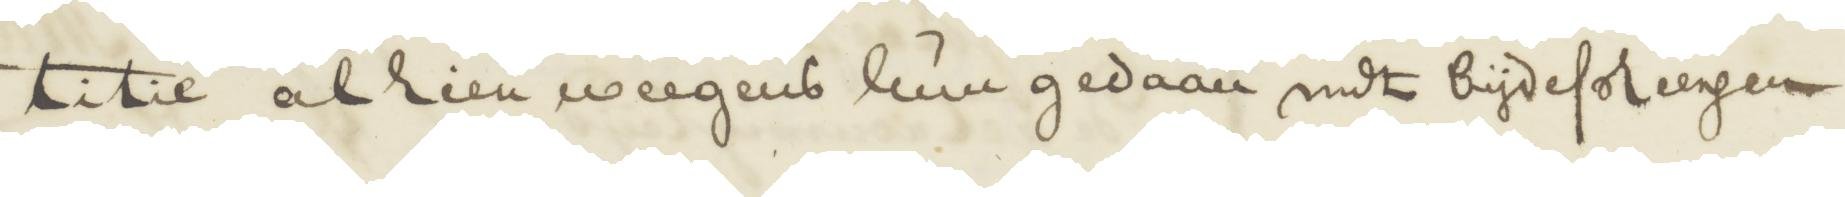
titie alhier weegens hun gedaan met bijdescheepen
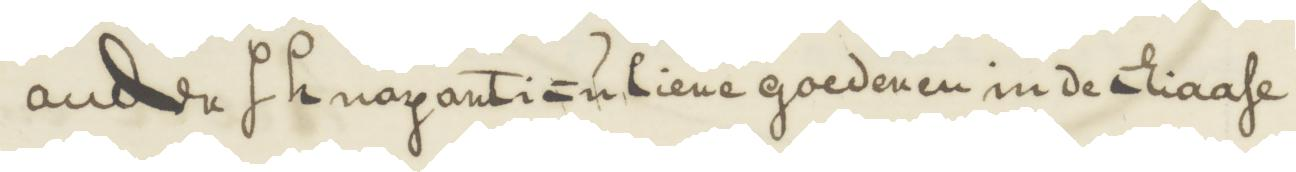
ander s k naparticuliere goederen in de chiaase
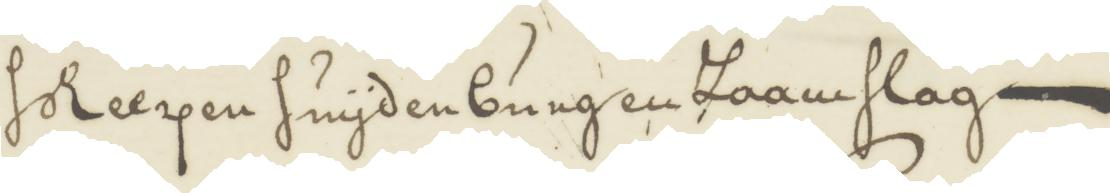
scheepen suijdenburg en zaamslag —
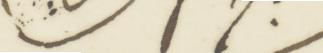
N7:
